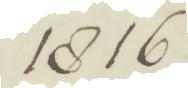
1816
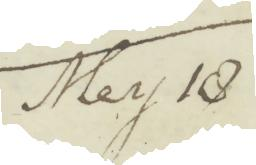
Meij 18
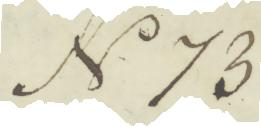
N 73
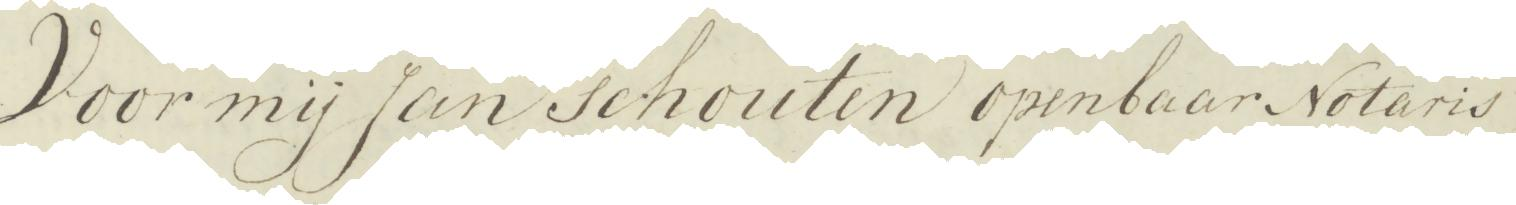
Voor mij Jan schouten openbaar Notaris
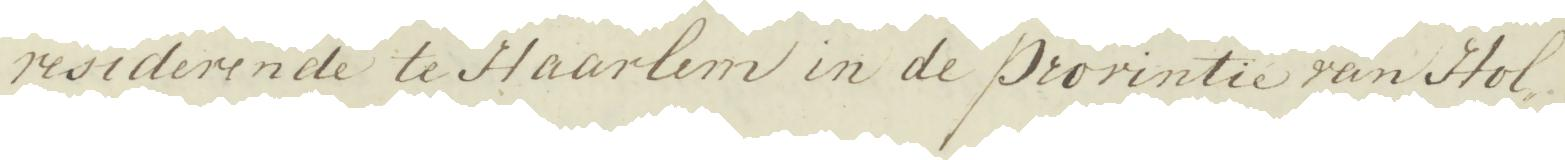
residerende te Haarlem in de Provintie van Hol„
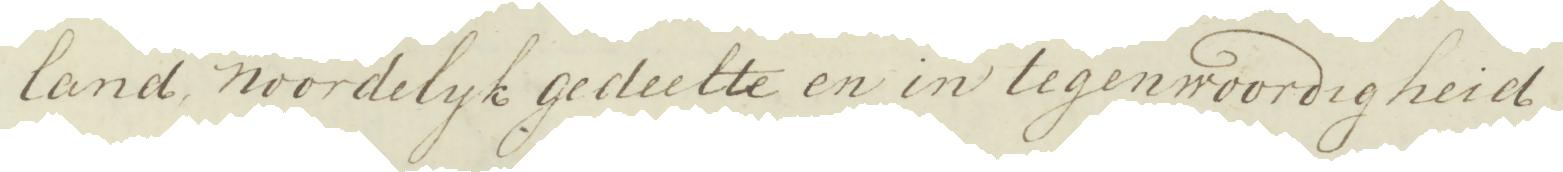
land, noordelijk gedeelte en in tegenwoordigheid
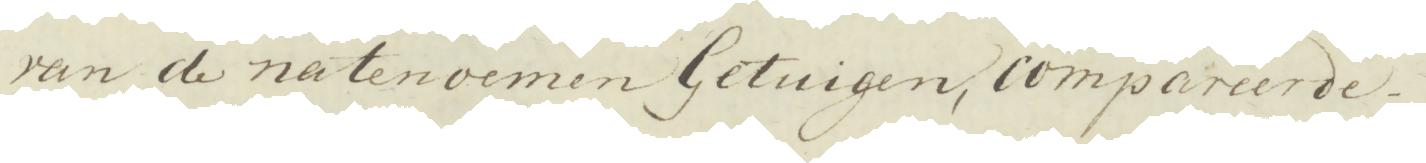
van de na tenoemen Getuigen, compareerde-
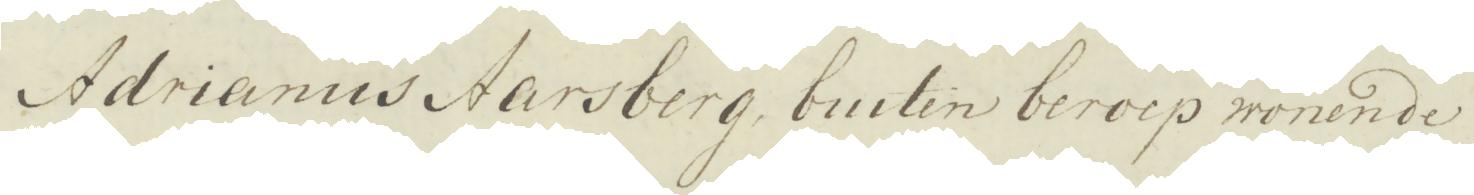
Adrianus Aarsberg, buiten beroep wonende
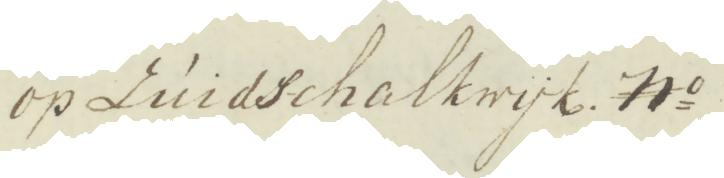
op Zuidschalkwijk N=o
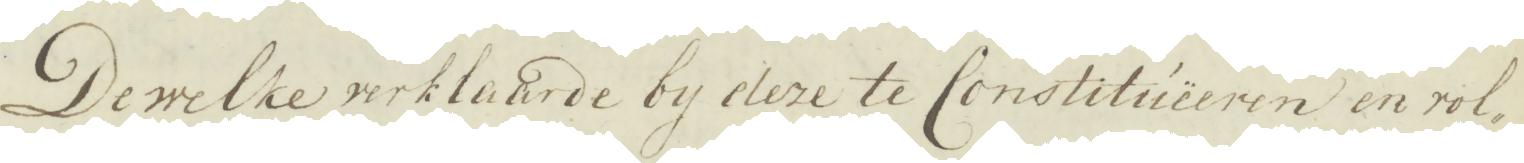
De welke verklaarde by deze te Constituëeren en vol„
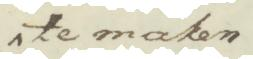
^ te maken
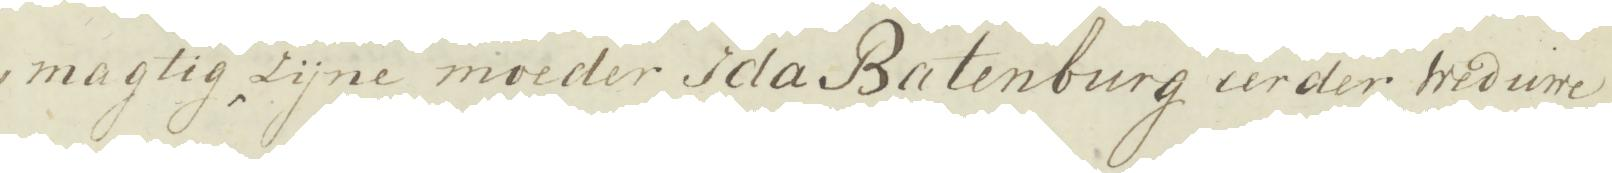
magtig ^ zijne moeder Ida Batenburg eerder weduwe
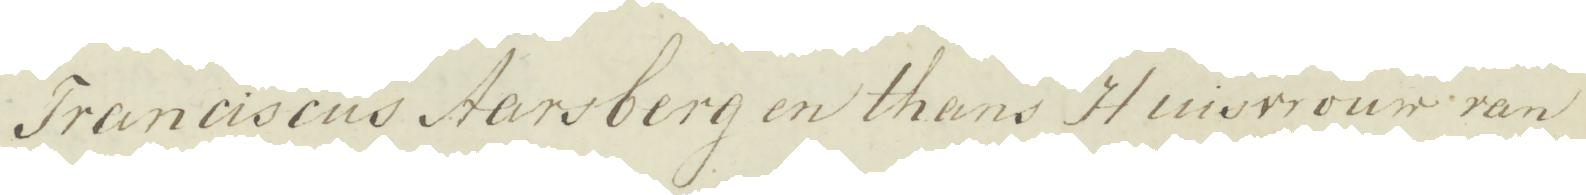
Franciscus Aarsberg en thans Huisvrouw van
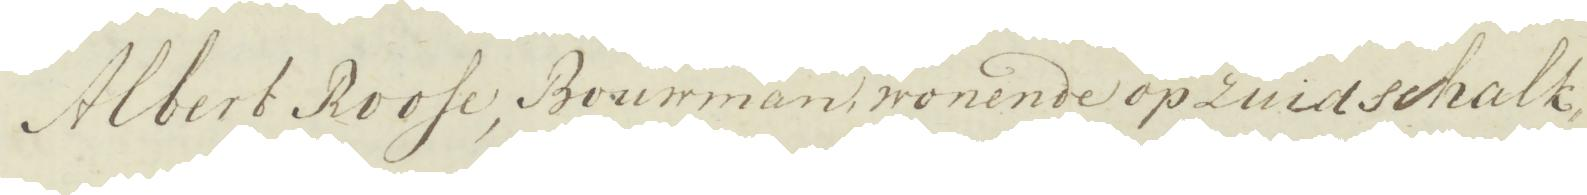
Albert Roose, Bouwman, wonende op zuidschalk„
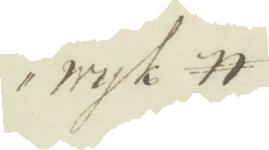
„wijk N
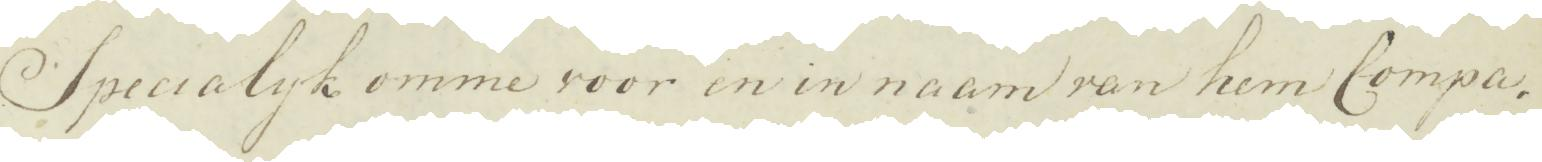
Specialyk omme voor en in naam van hem Compa„
